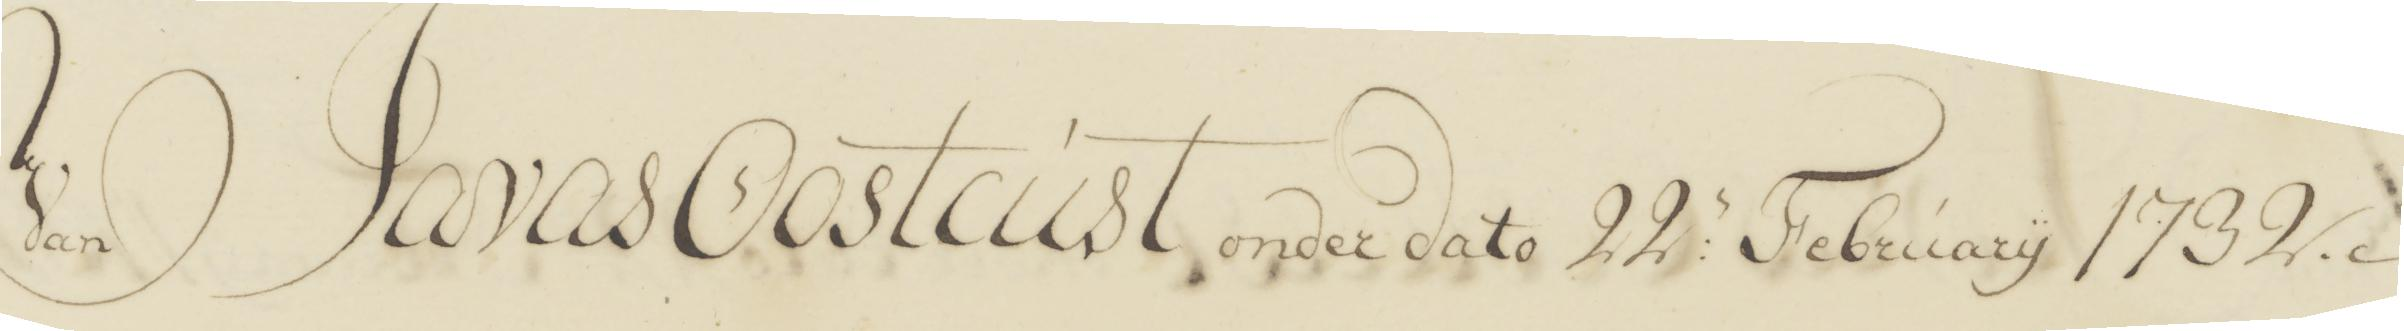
Van Javas Oostcust onder dato 22:' Februarij 1732. —
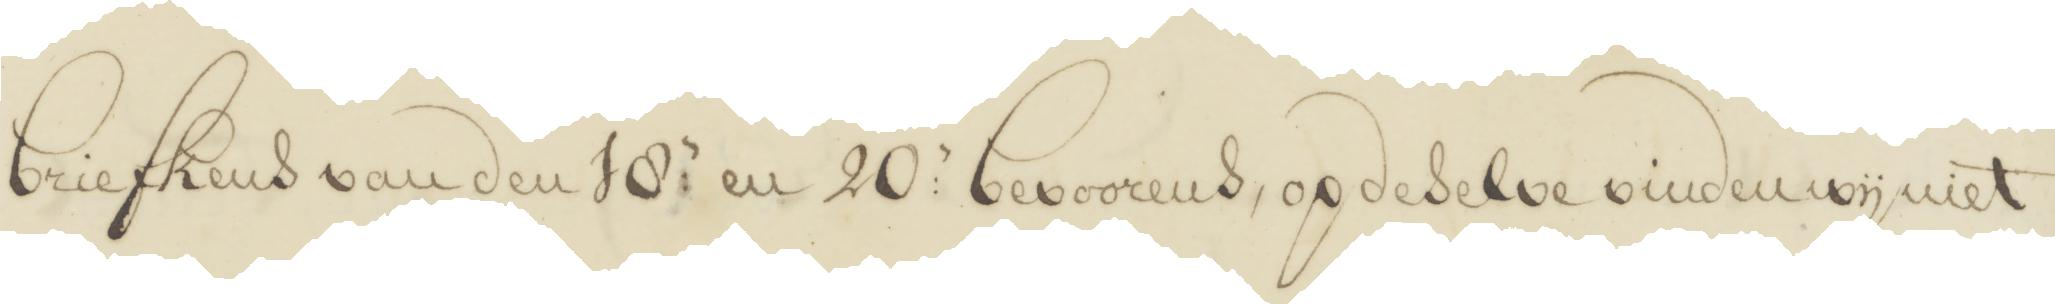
briefkens van den 18:' en 20:' bevoorens, op deselve vinden wij niet
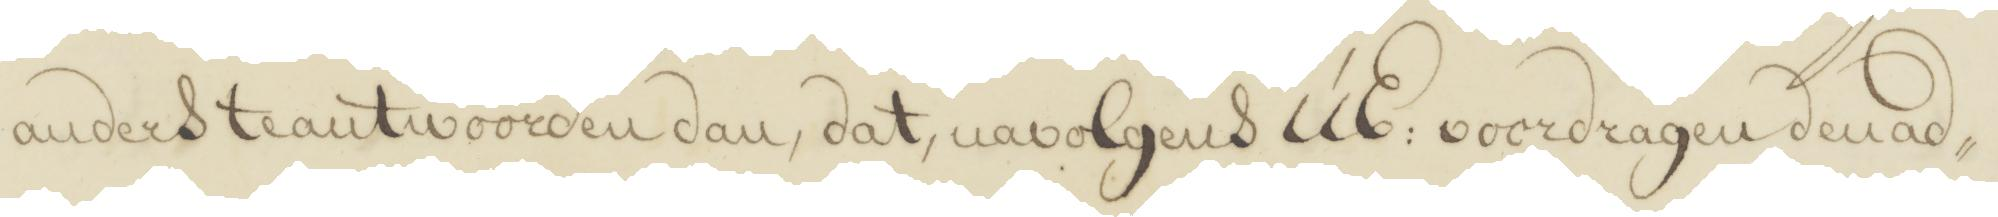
anders te antwoorden dan, dat, navolgens UE: voordragen den ad„
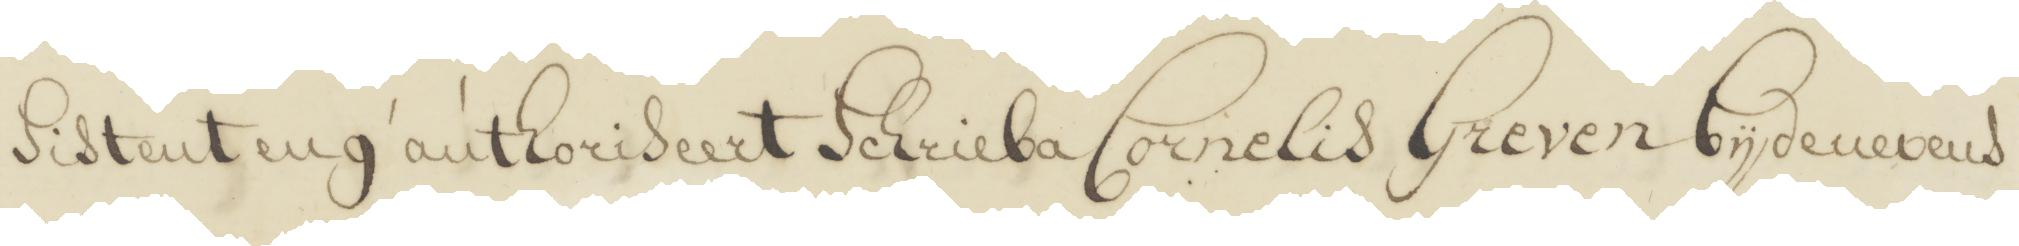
sistent en g’authoriseert schrieba Cornelis Greven bij de nevens
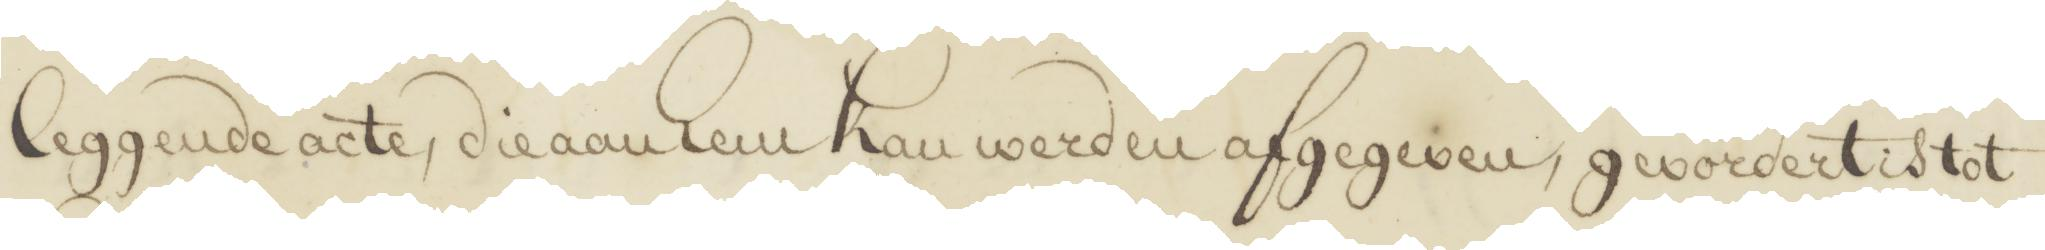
leggende acte, die aan hem kan werden afgegeven, gevordert is tot
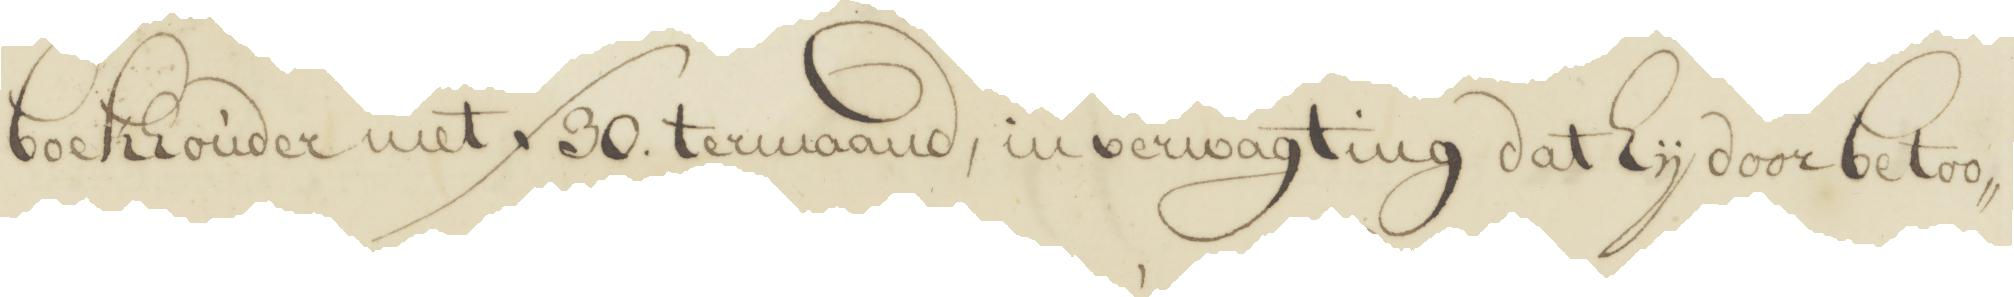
boekhouder met ƒ30. termaand, in verwagting dat hij door betoo„
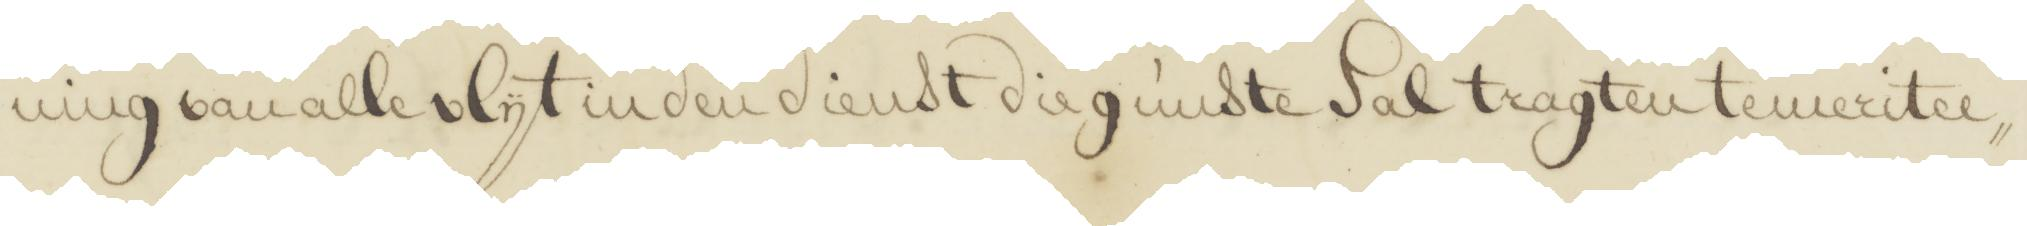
ning van alle vlijt in den dienst die gunste sal tragten temeritee„
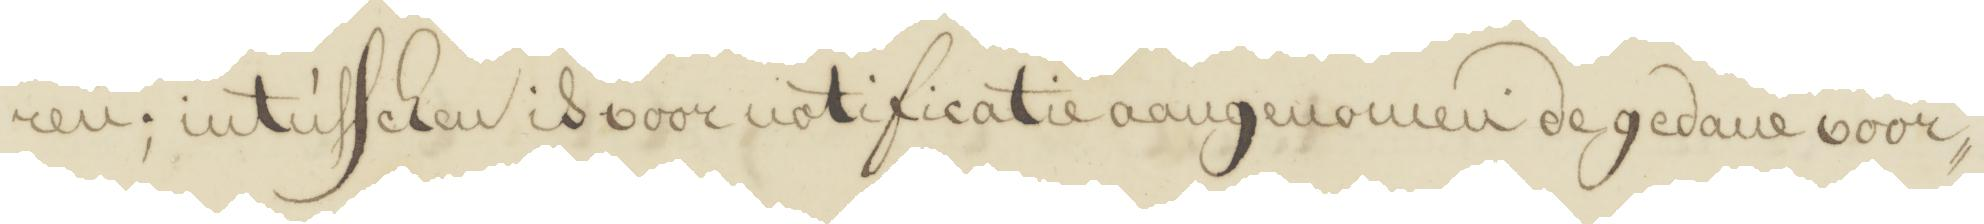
ren; intusschen is voor notificatie aangenomen de gedane voor„
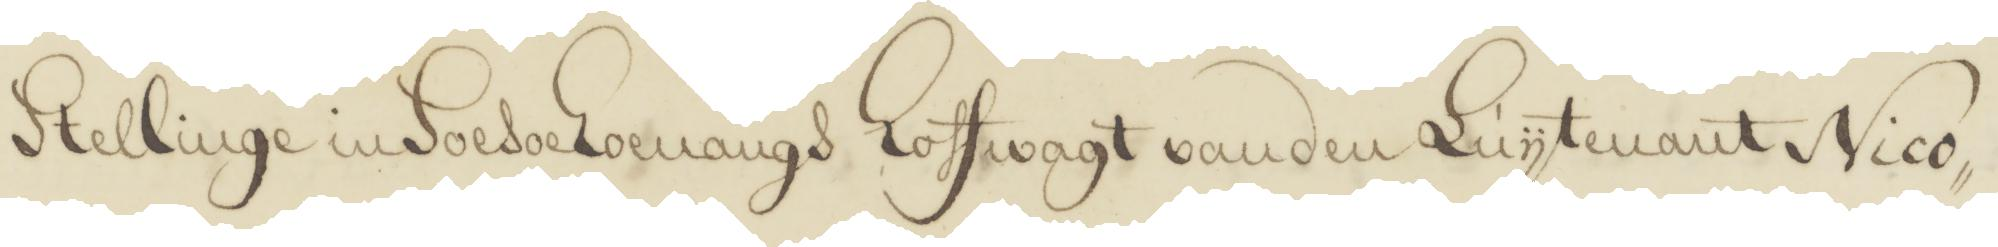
stellinge in soesoehoenangs hoffwagt van den Luijtenant Nico„
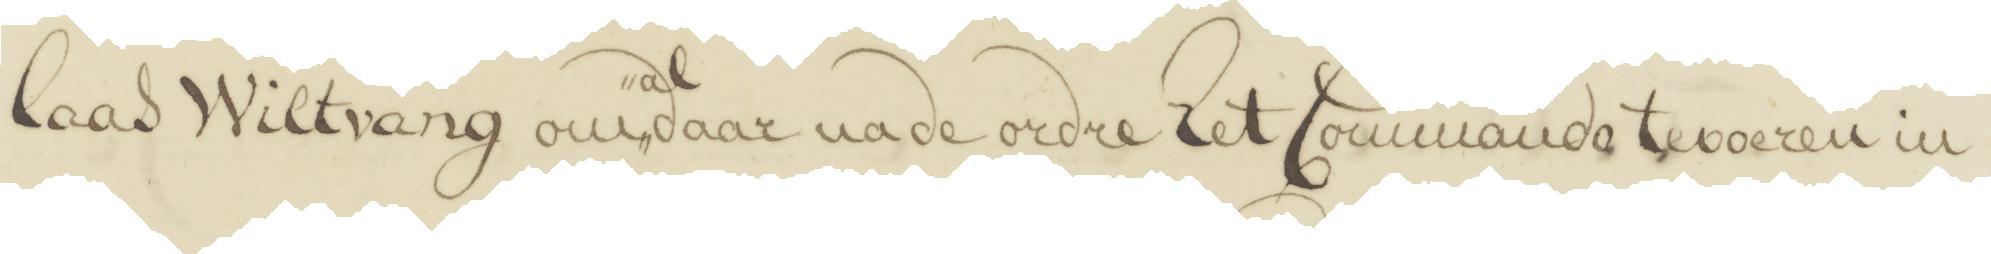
laas Wiltvang om „al „daar na de ordre het Commando tevoeren in
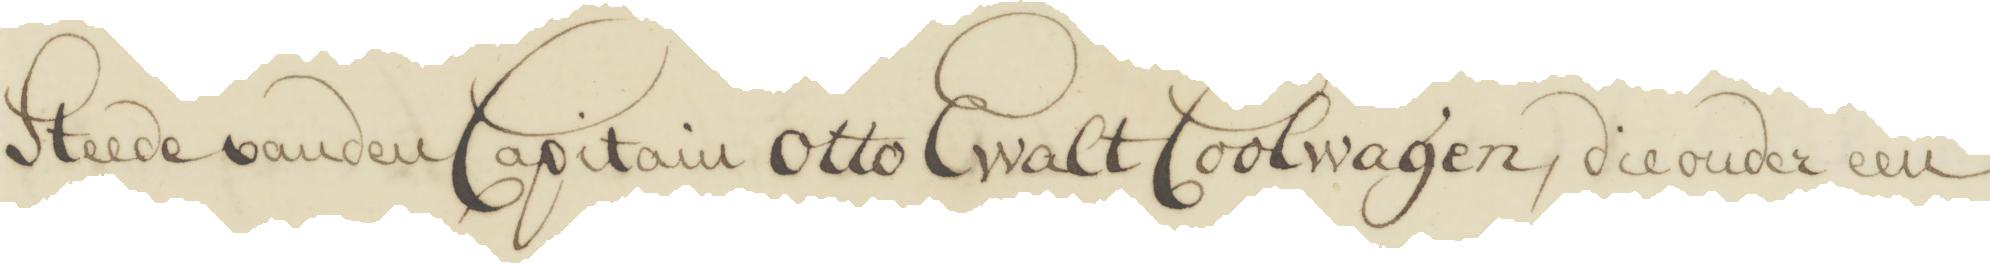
steede van den Capitain otto Ewalt Coolwagen, die onder een
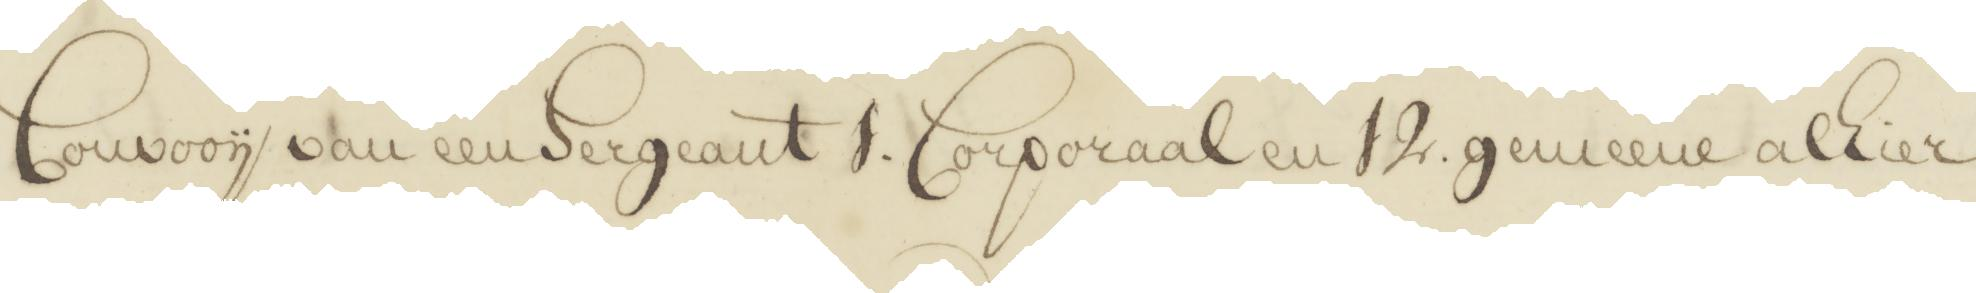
Convooij van een sergeant 1. Corporaal en 12. gemeene alhier
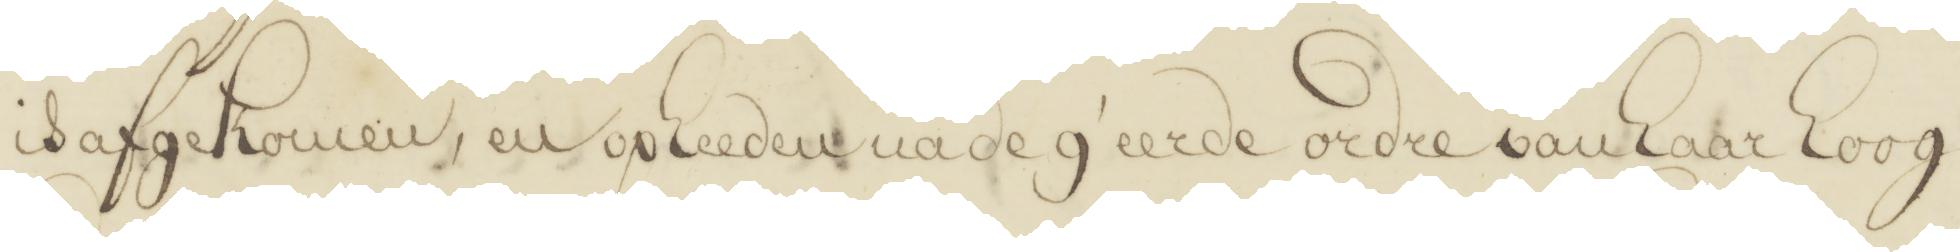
is afgekomen, en opheeden na de g’eerde ordre van haar hoog
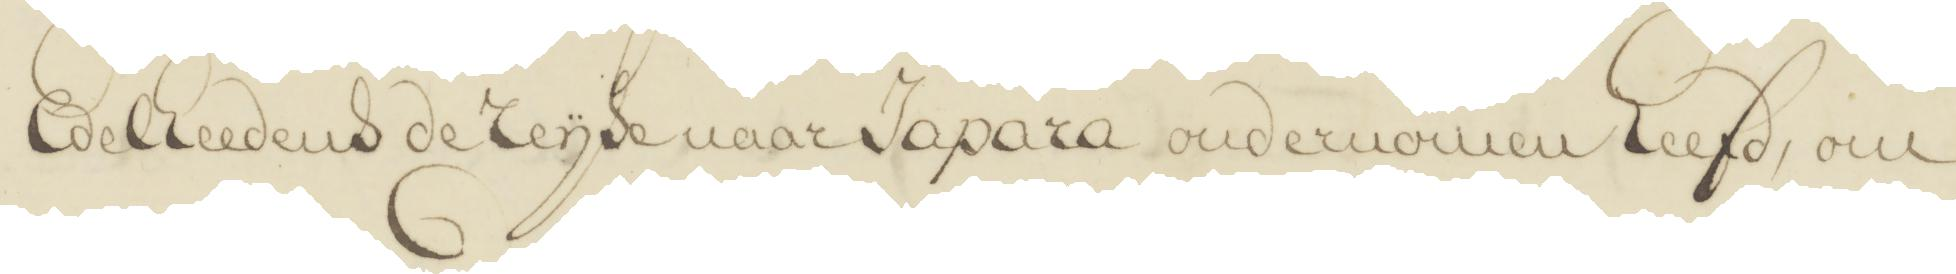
Edelheedens de reijse naar Iapara ondernomen heefd, om
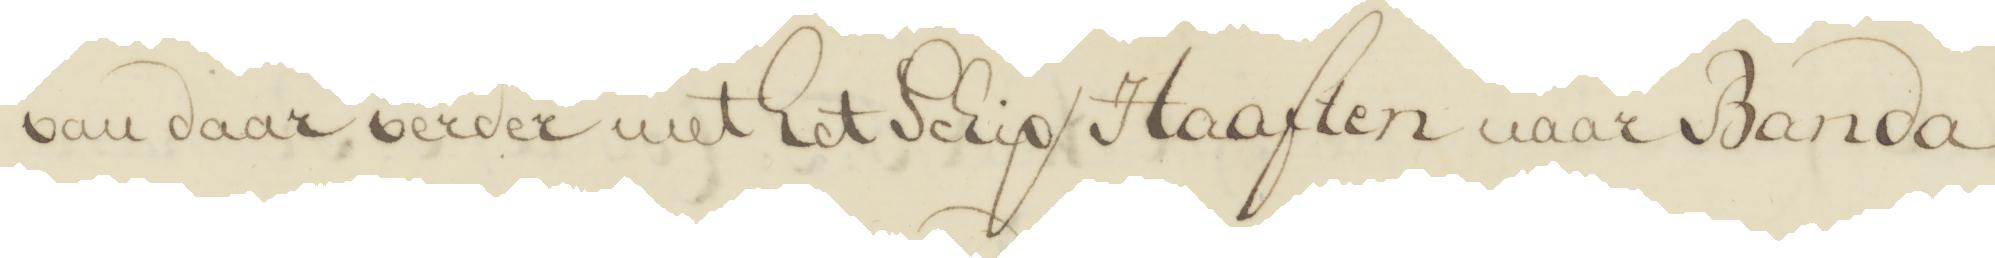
van daar verder met het schip Haaften naar Banda
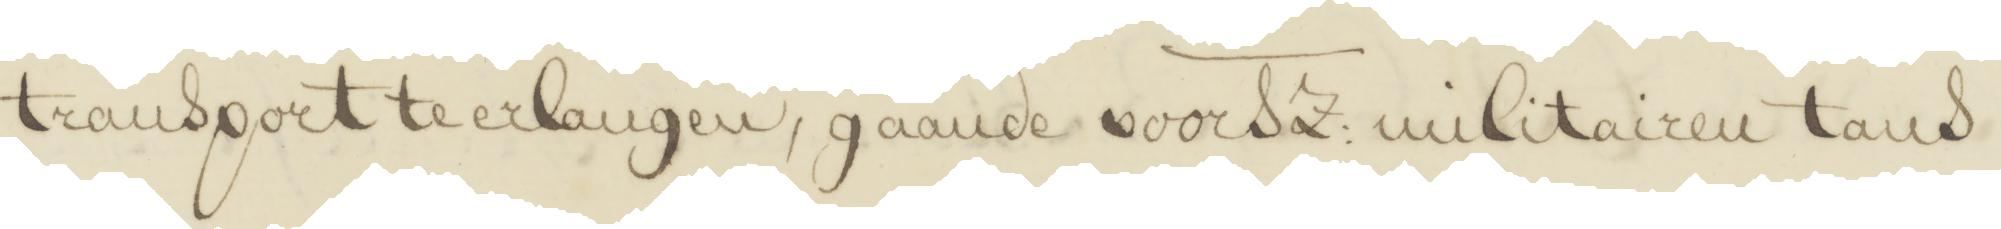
transport te erlangen, gaande voorsz: militairen tans
